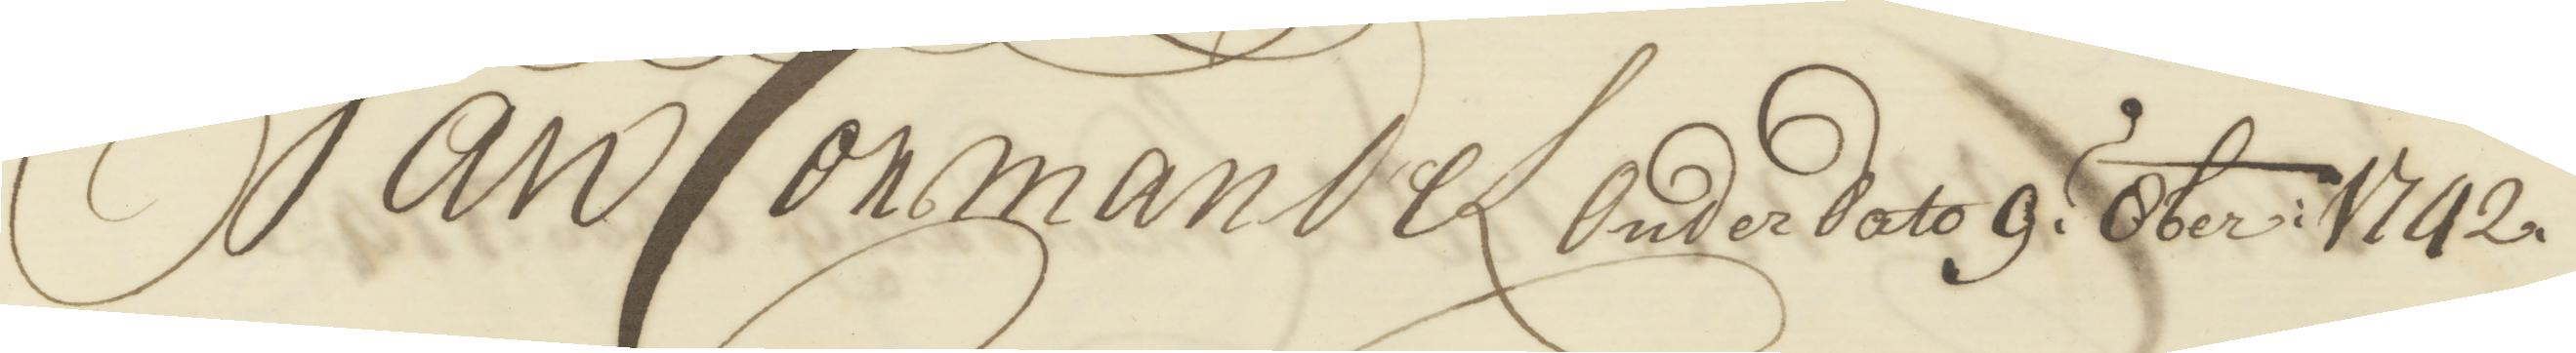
Van Cormandel Onder dato 9:' 8ber: 1742.
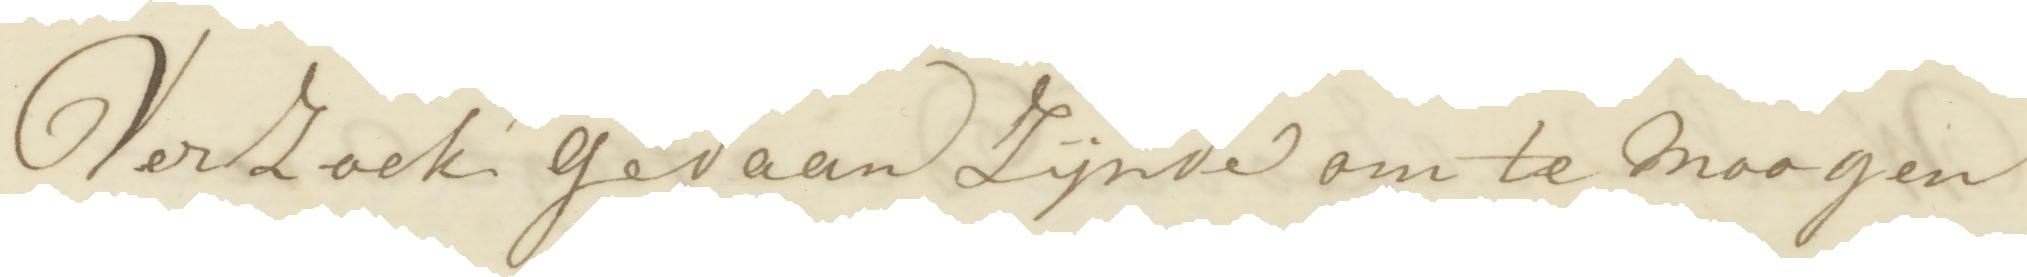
Verzoek gedaan zijnde om te moogen
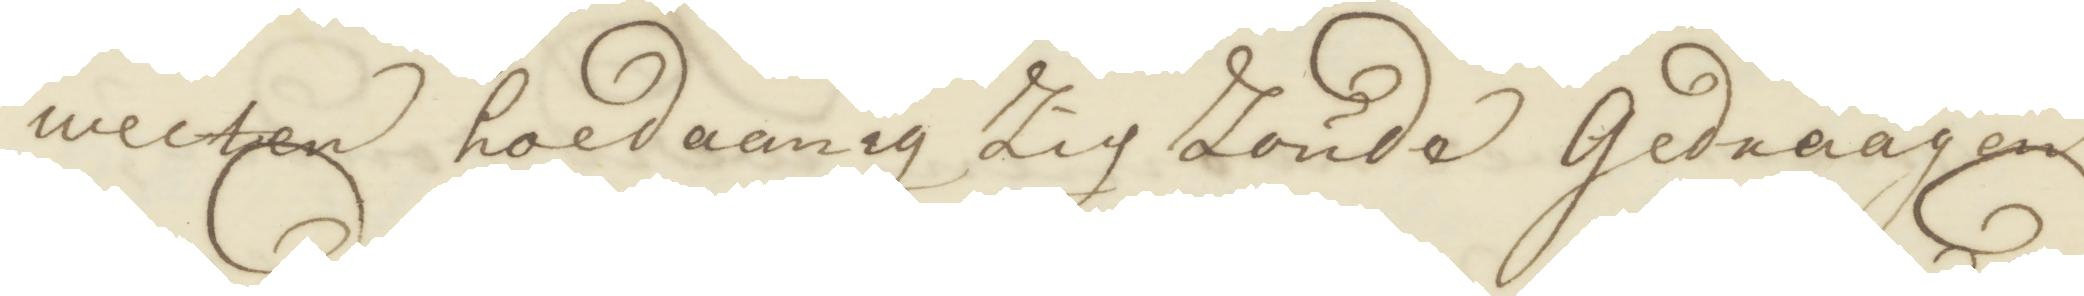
weeten hoedaanig zig zoude gedraagen
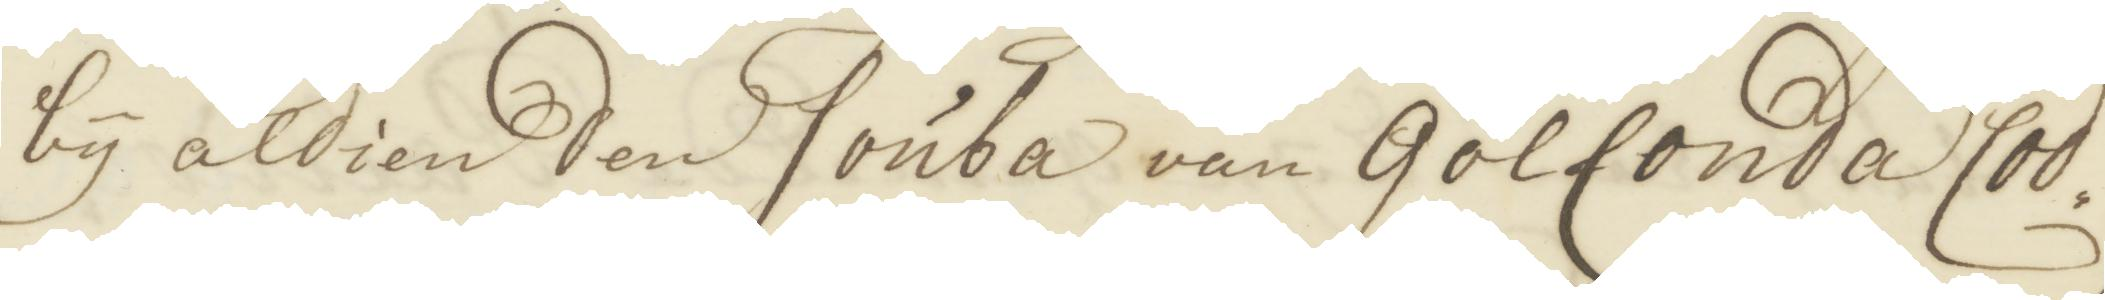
bij aldien den souba van golconda Cod„
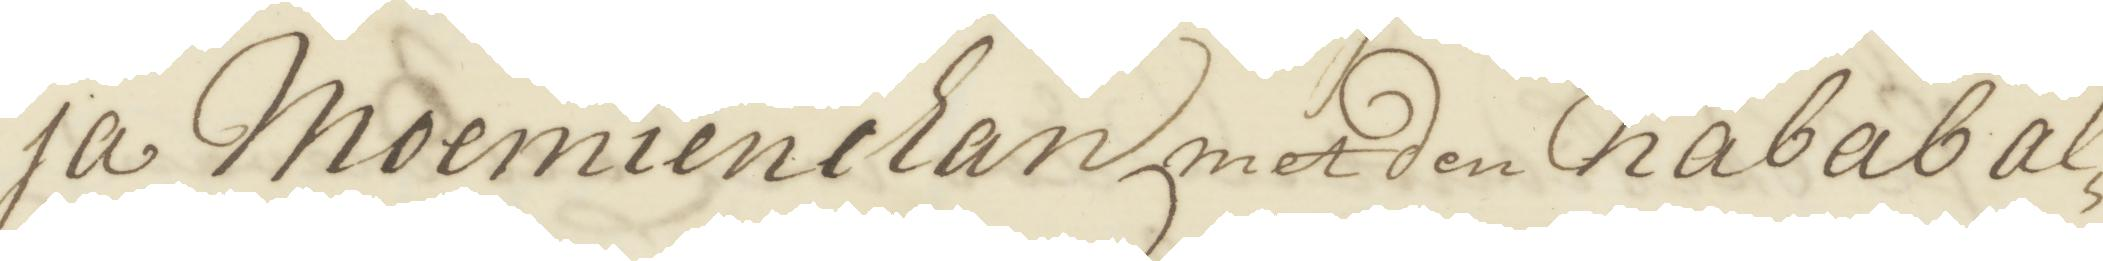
ja Moemienchan met den nabab al„
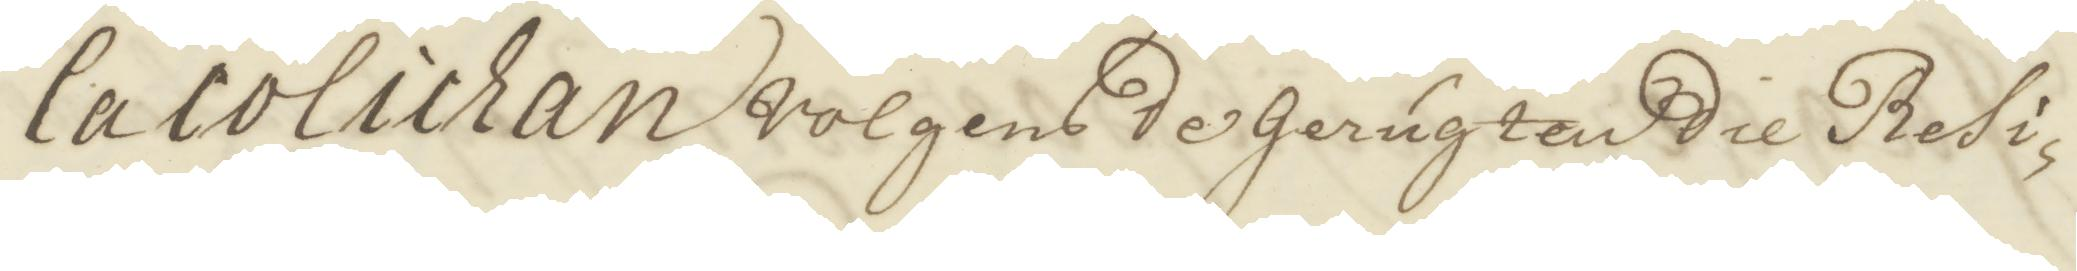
lacolichan volgens de gerugten die Resi„
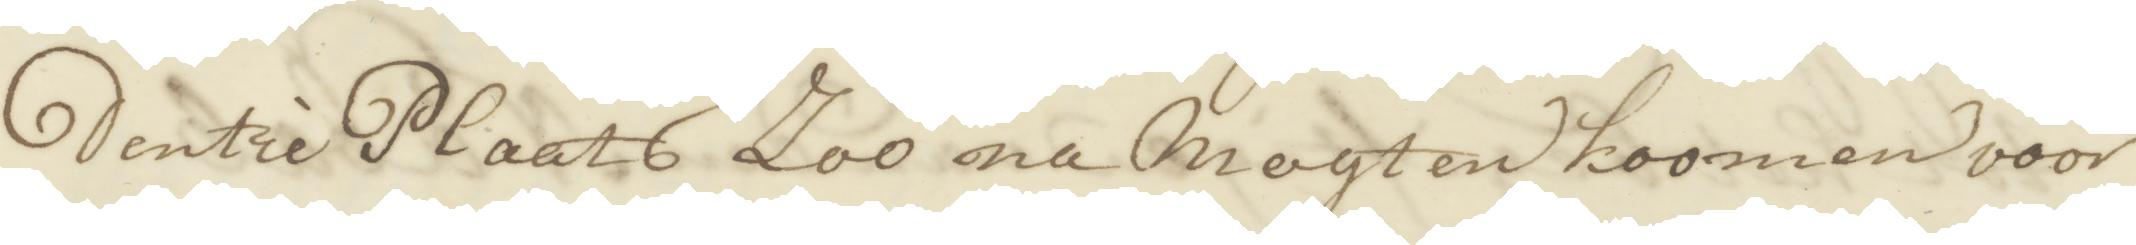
dentie Plaats zoo na mogten koomen voor
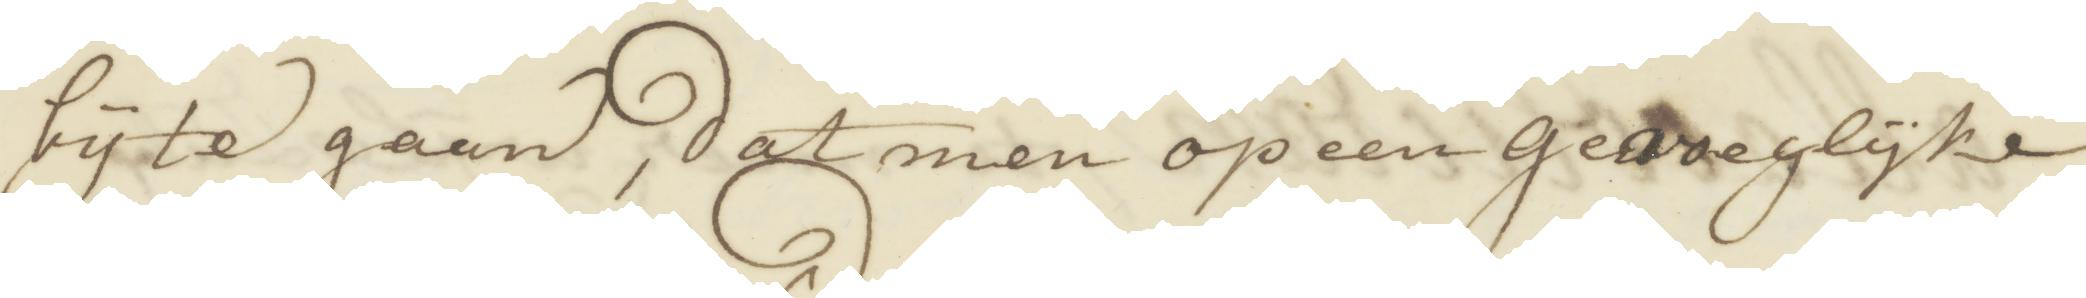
bij te gaan, dat men op een gevoeglijke
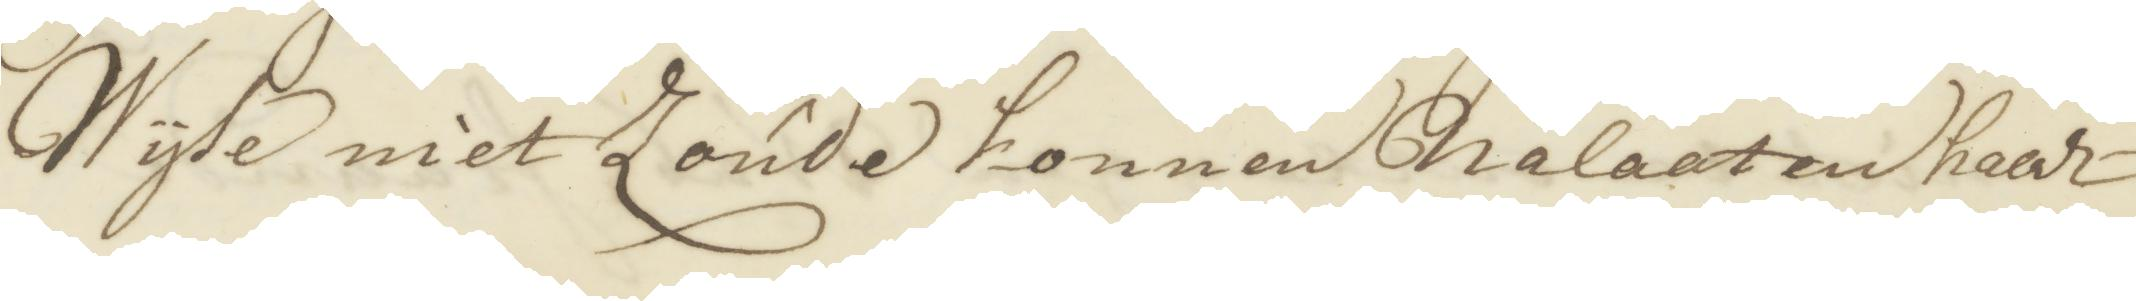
Wijse niet zoude konnen nalaaten haar
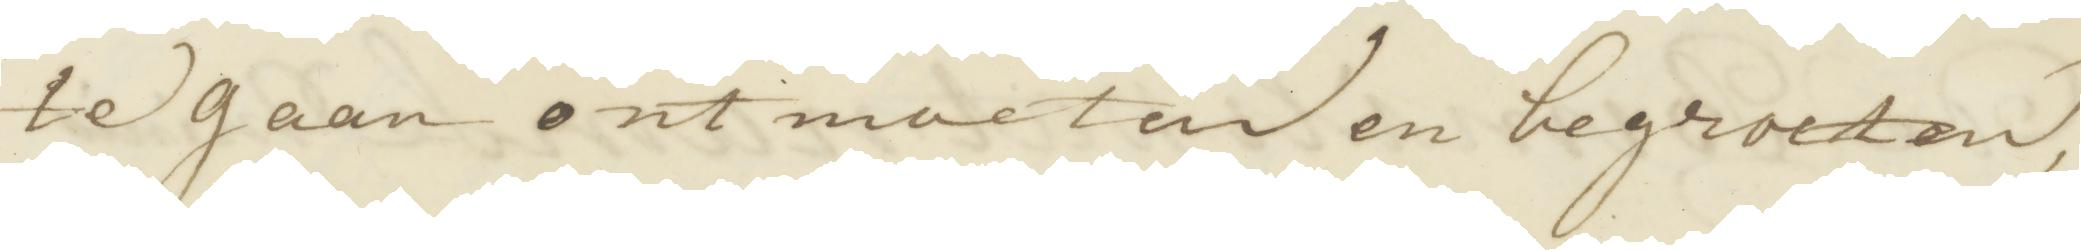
te gaan ontmoeten en begroeten,
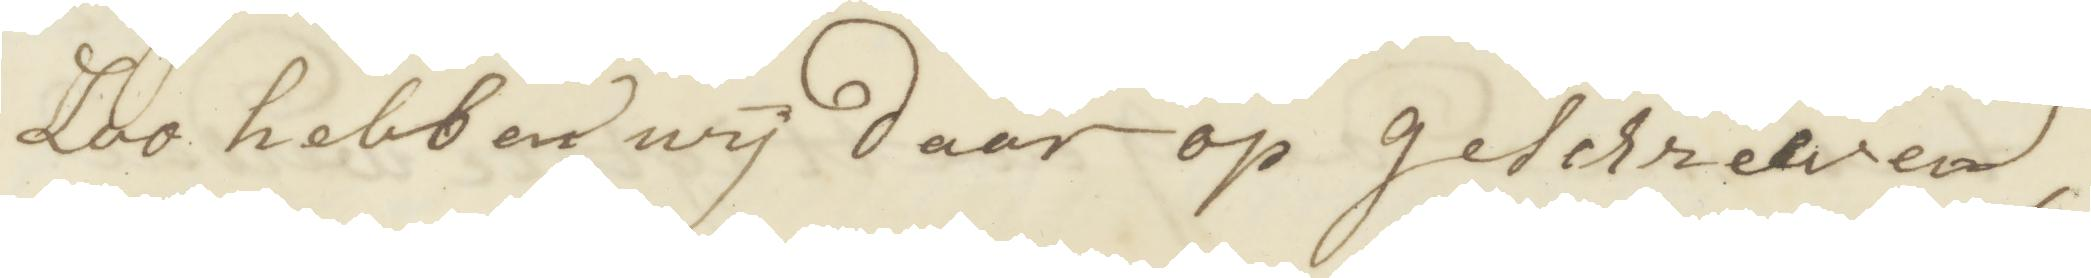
zoo hebben wij daar op geschreeven,
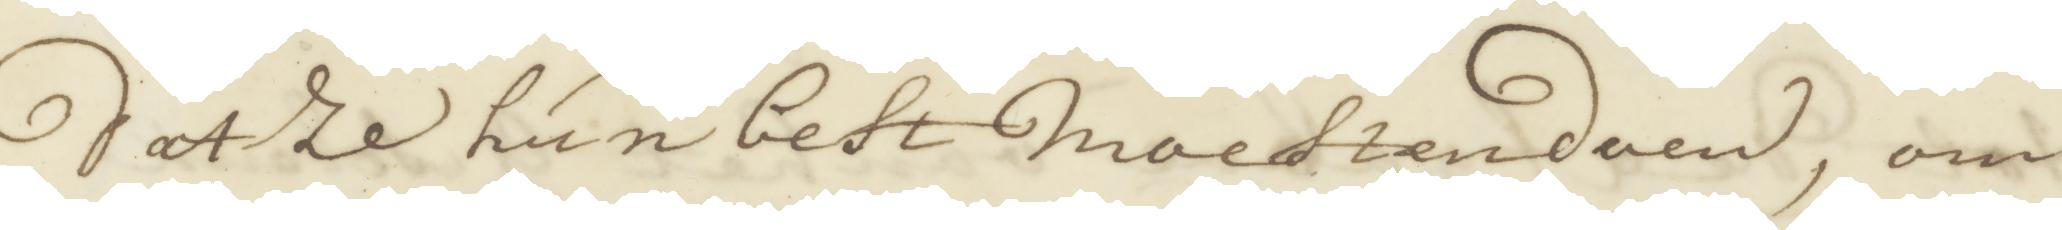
dat ze hun best moesten doen, om
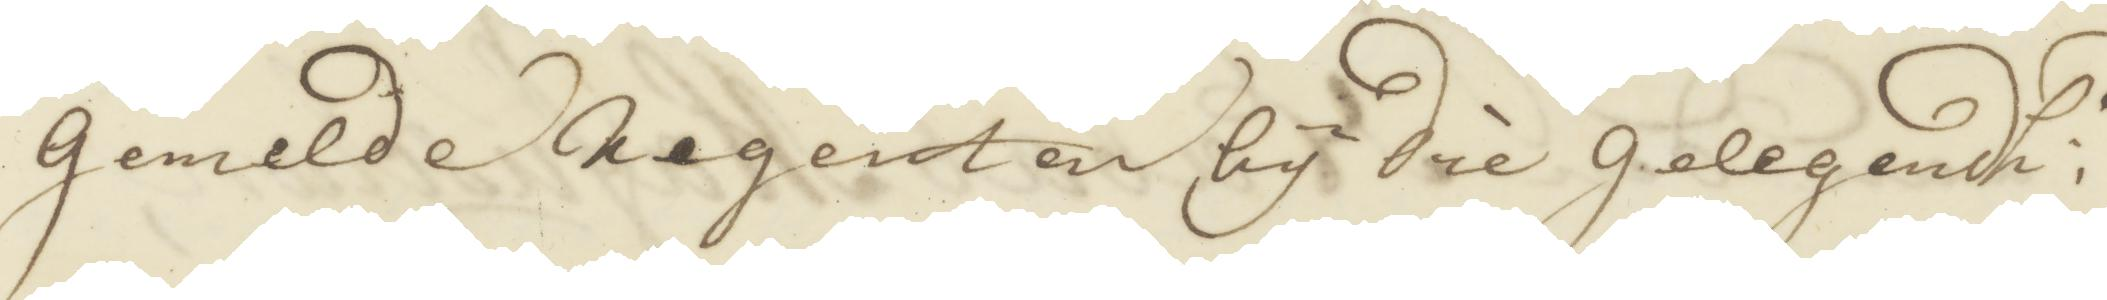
gemelde regenten bij die gelegendh:d
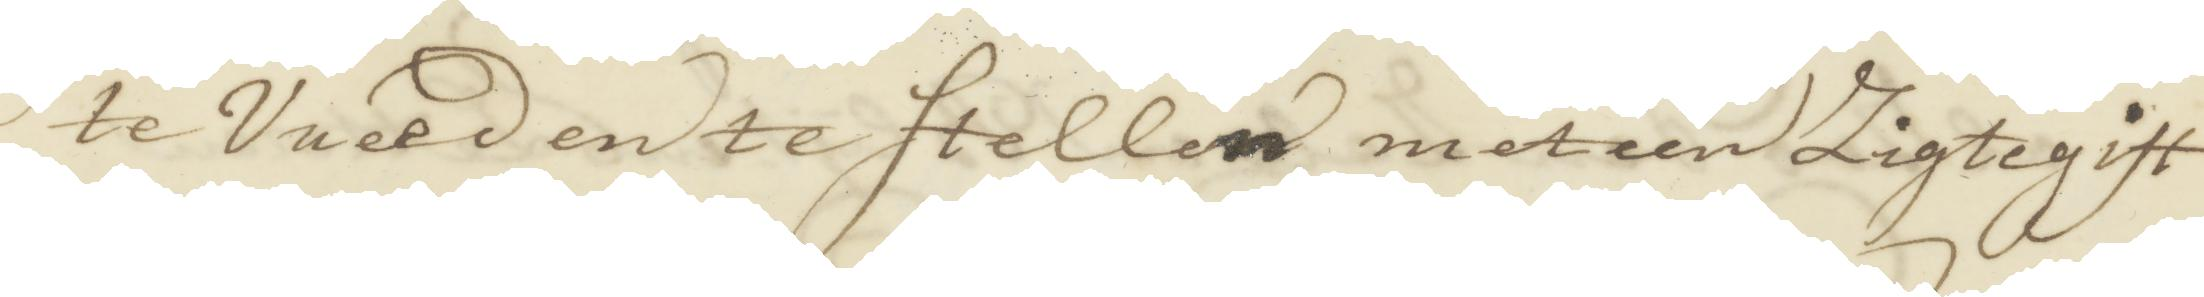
te vreeden te stellen met een zigtegift
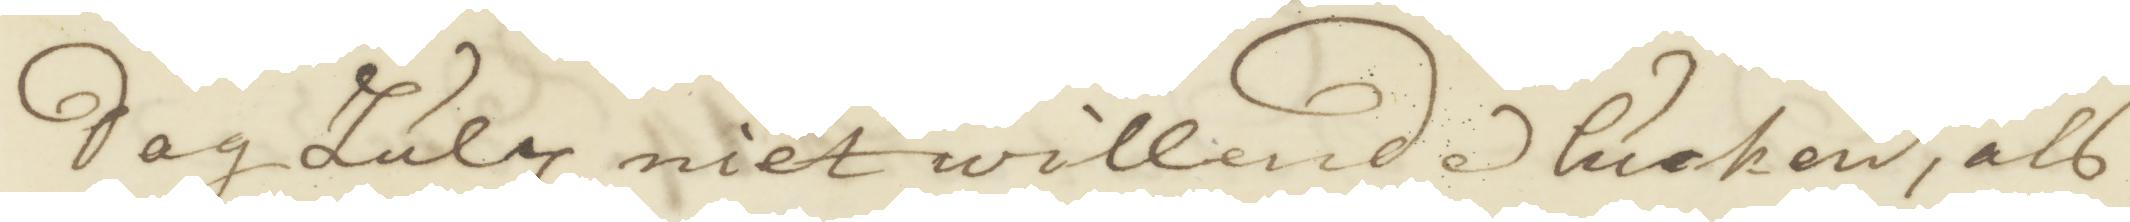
dog zulx niet willende lucken, als
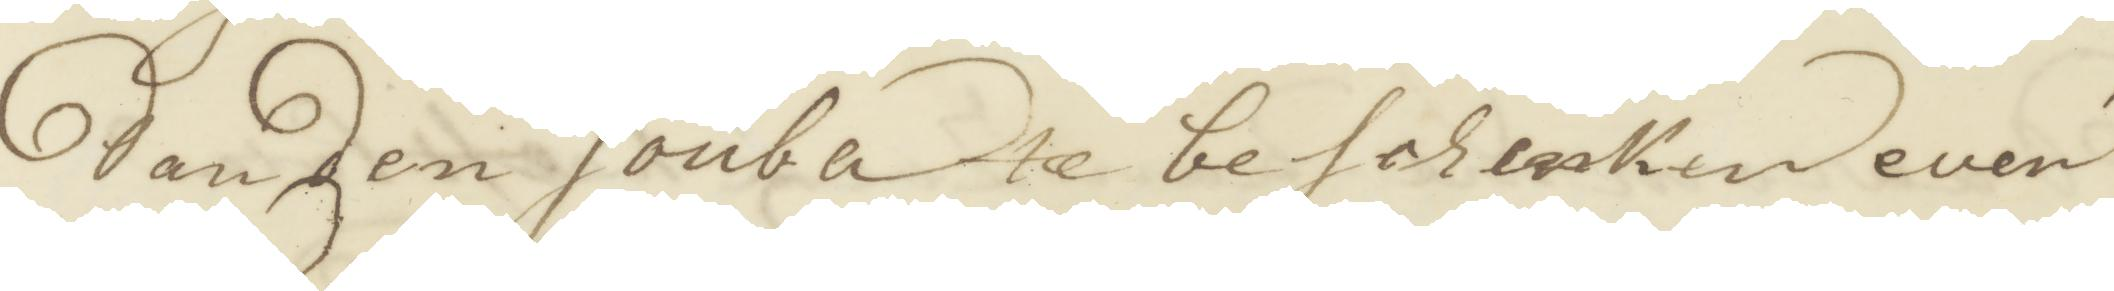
dan den souba te beschenken even
